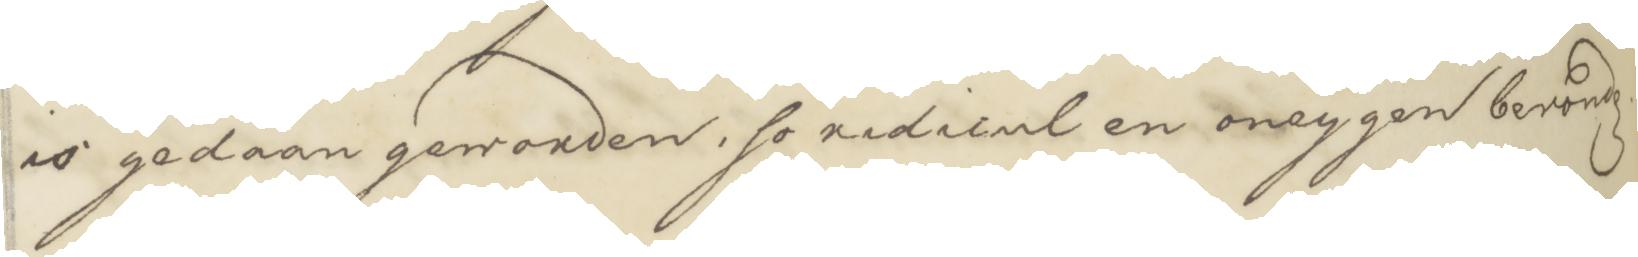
is gedaan geworden, so ridicul en oneijgen bevonden
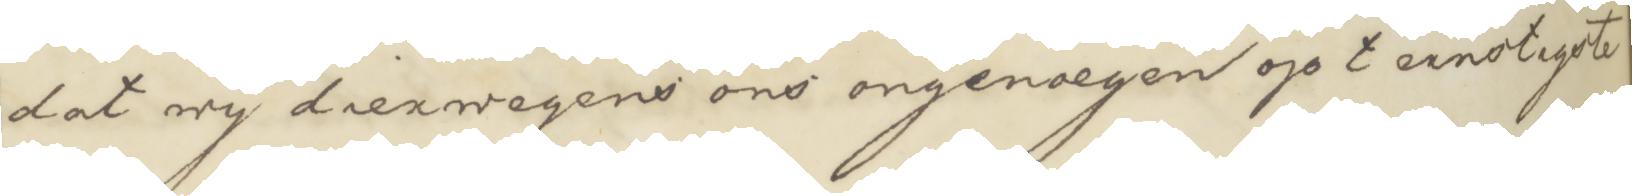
dat wij dierwegens ons ongenoegen op ’t ernstigste
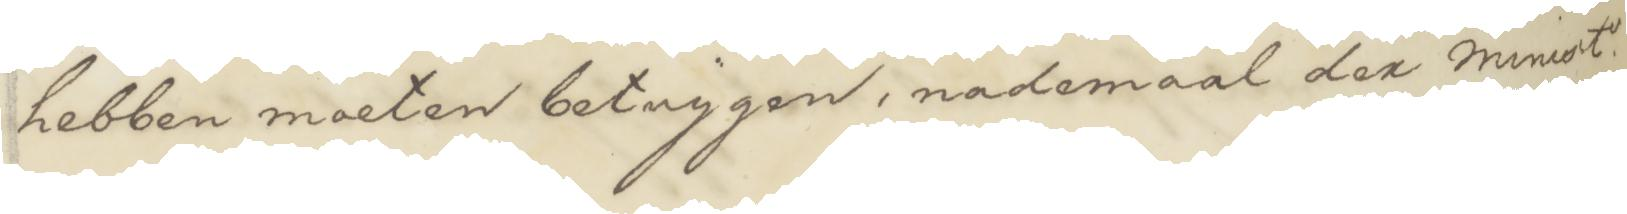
hebben moeten betuijgen, nademaal der minist.e
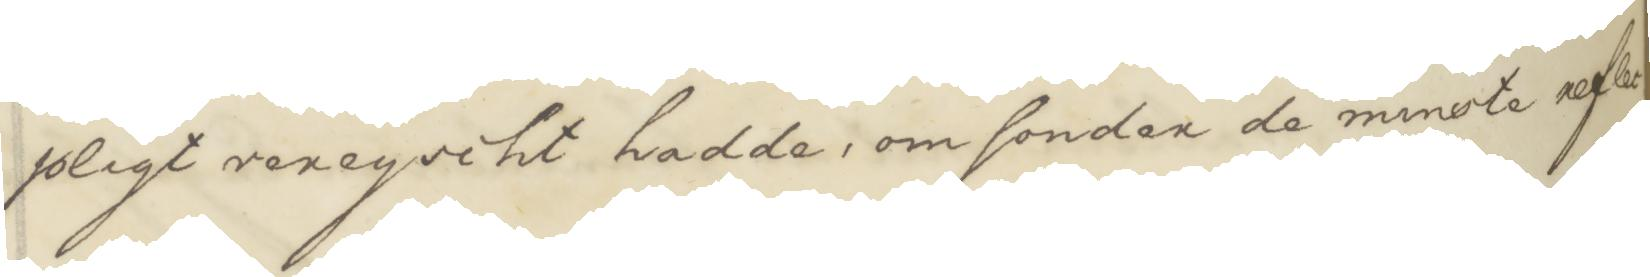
pligt vereijscht hadde, om sonder de ministe reflec
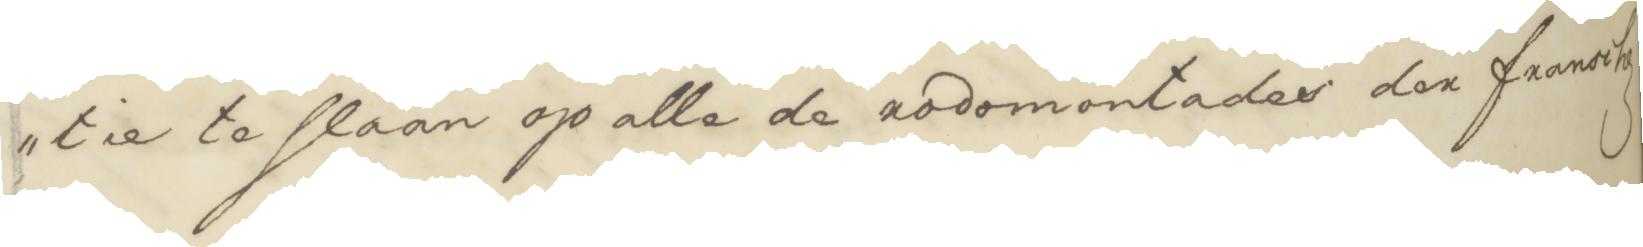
„tie te slaan op alle de rodomontades der franschen
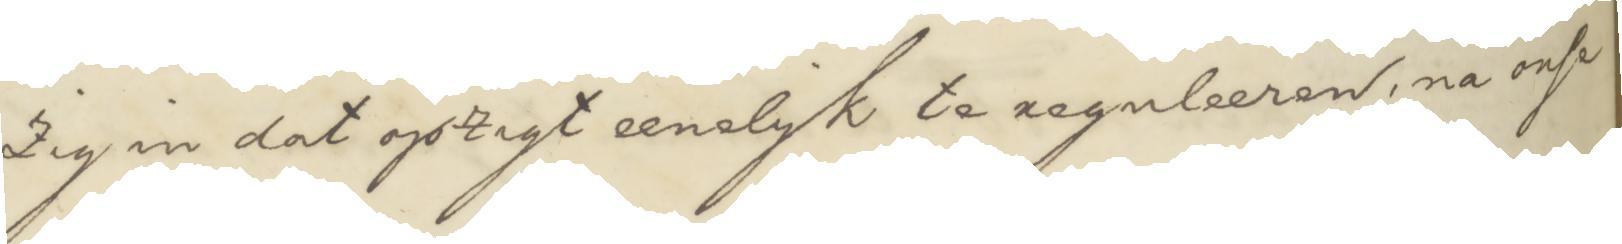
zig in dat opzigt eenelijk te reguleeren, na onse
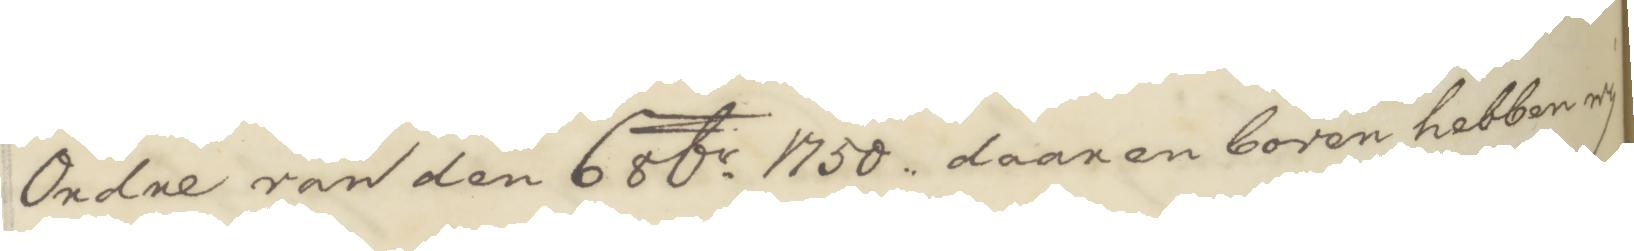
Ordre van den 6 8„br 1750„ daar en boven hebben wij
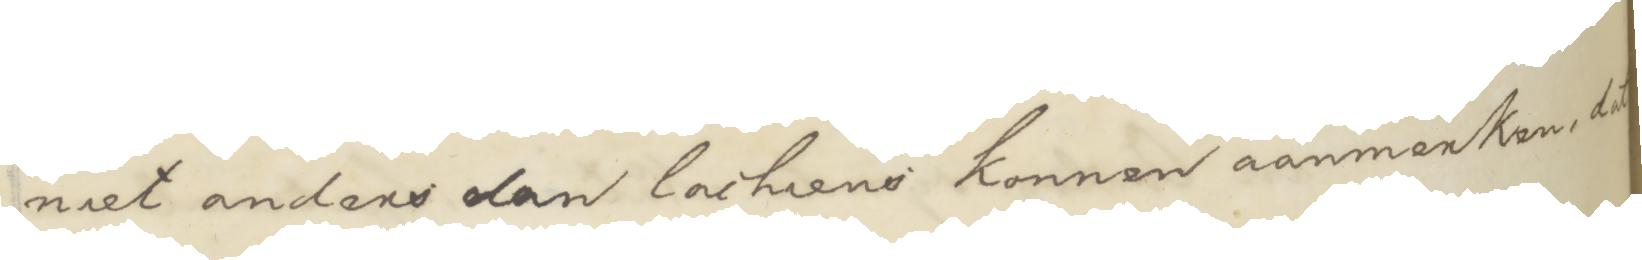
niet anders dan lachieus konnen aanmerken, dat
